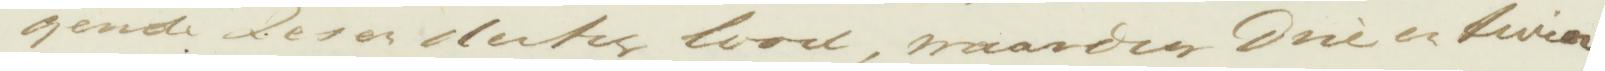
gende Zes en dertig lood, waardig drie en twin
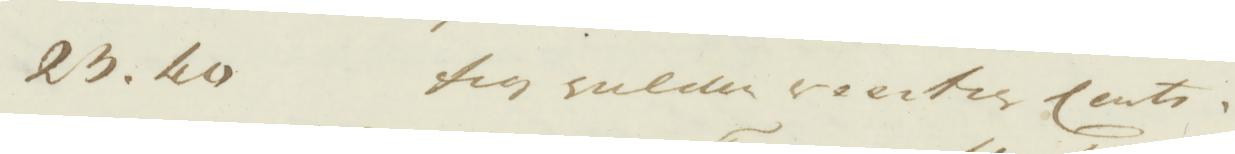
23. 40 tig gulden veertig Cents
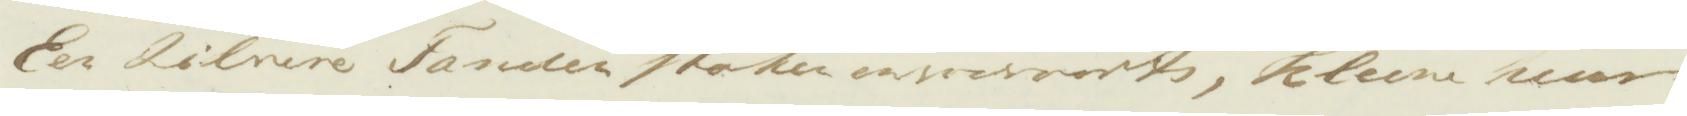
Een zilvere Tanden stoker enzoovoorts, kleine keur
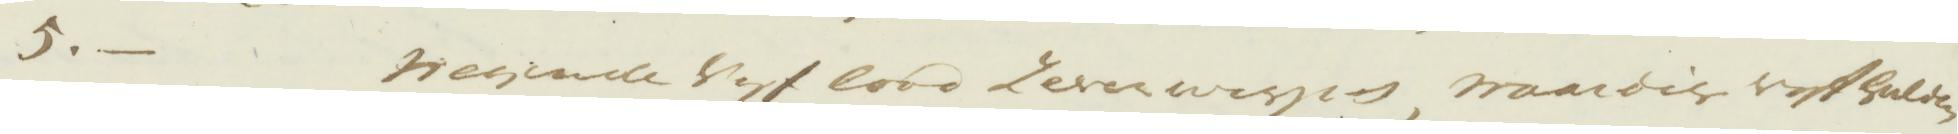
5. — wegende vyf lood zeven wigjes, waardig vyf Gulden
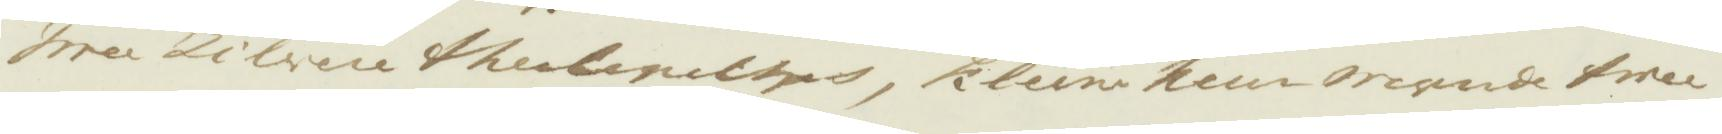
Twee Zilvere Theelepeltjes, kleine keur wegende twee
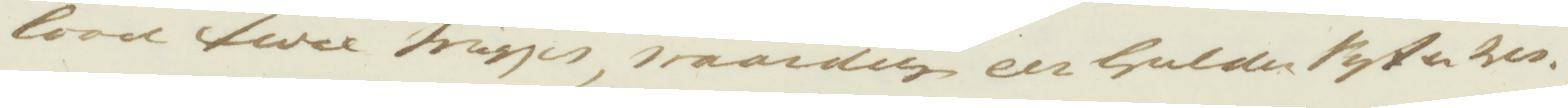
lood twee wigjes, waardig een Gulden Vyf en zes.
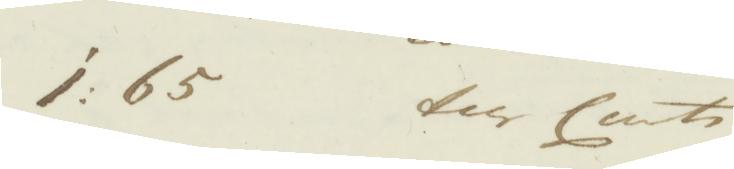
1: 65 tig Cents
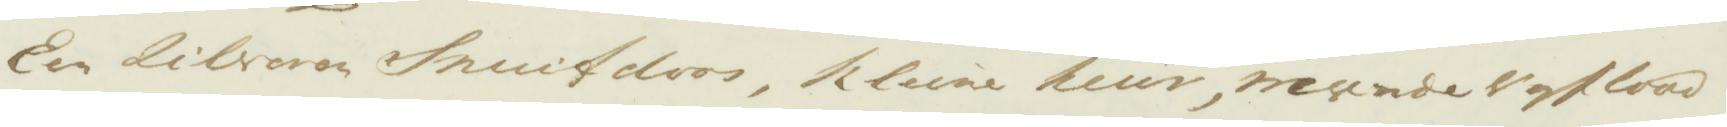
Een zilveren Snuifdoos, kleine keur, wegende vyf lood
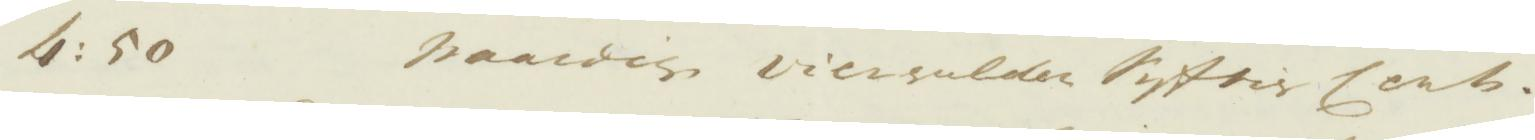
4: 50 waardig vier gulden Vyftig Cents
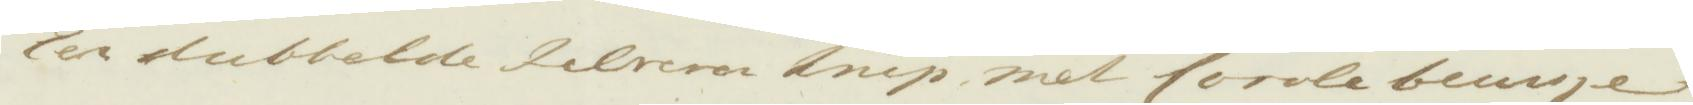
Een dubbelde zilveren knip, met Corale beursje
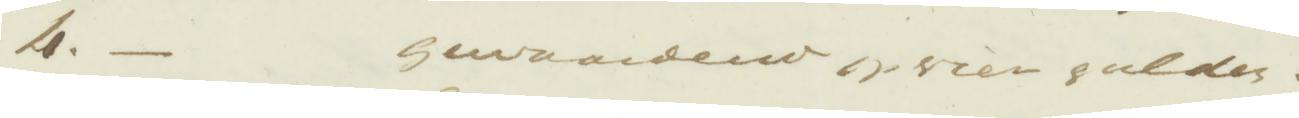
4. — gewaardeerd op vier gulden
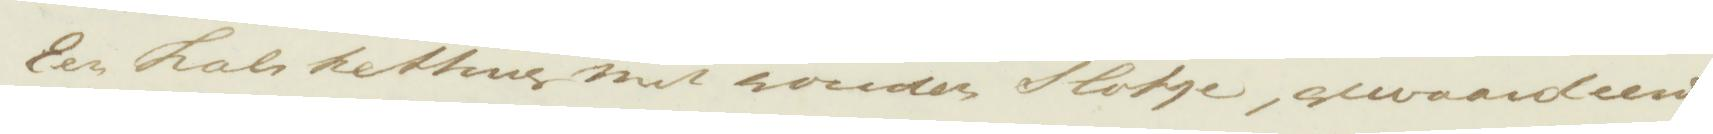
Een hals ketting met gouden slotje, gewaardeerd
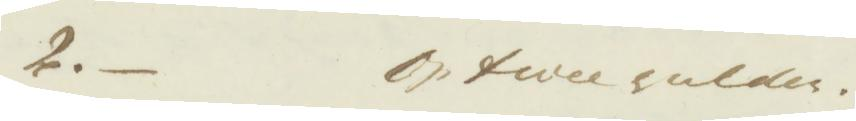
2. — Op twee gulden.
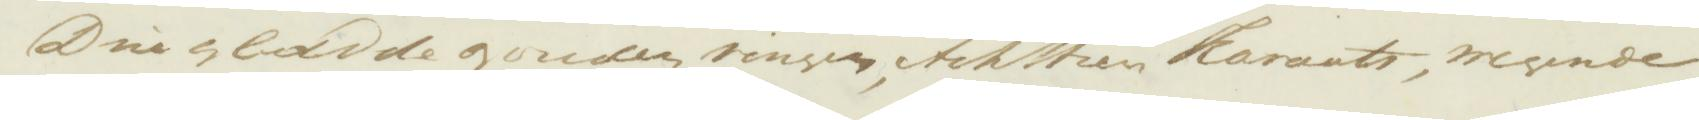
Drie gladde gouden ringen, Achttien karaats, wegende
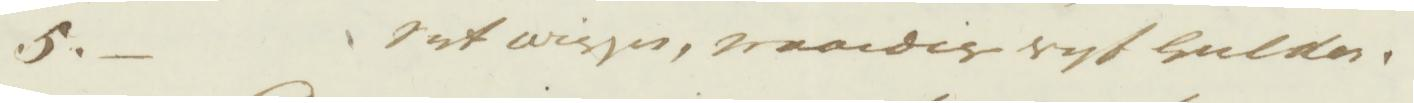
5. — vyf wigjes, waardig vyf Gulden.
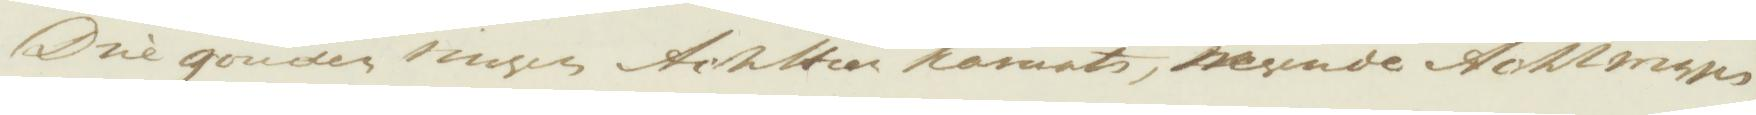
Drie gouden ringen Achttien karaats, wegende Acht wigjes
